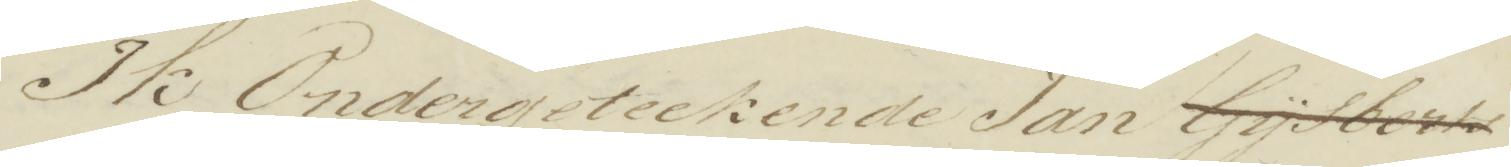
Ik Ondergeteekende Ian Gijsberts
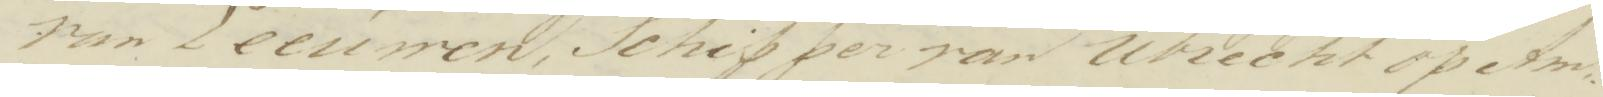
van Leeuwen, schipper van Utrecht op Am„
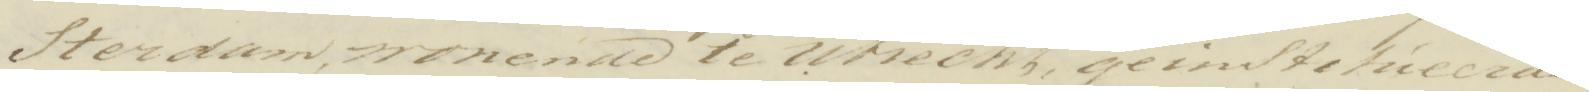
sterdam, wonende te Utrecht, geinstitueerde
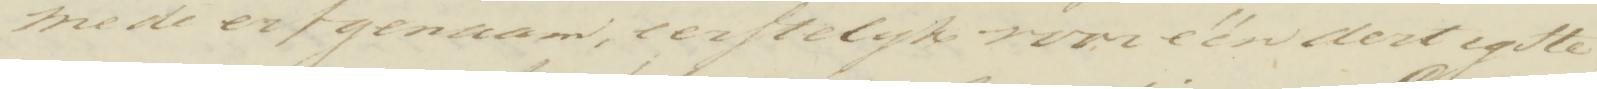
mede erfgenaam, eerstelijk voor één dertigste
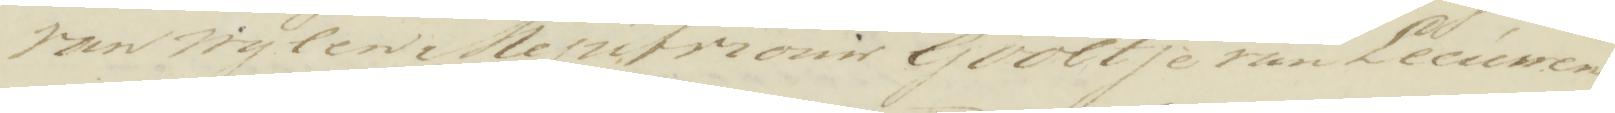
van wylen Mejufvrouw Gooltje van Leeuwen
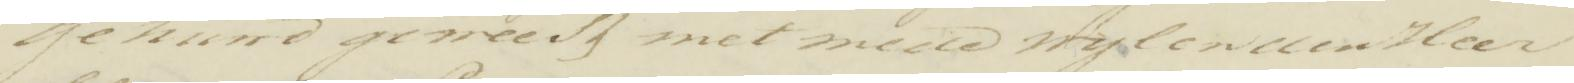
gehuwd geweest met mede wylen den Heer
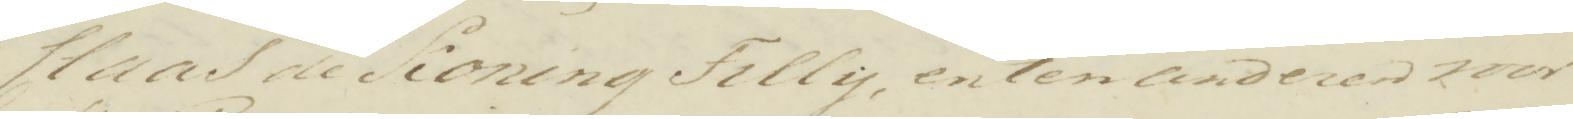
Claas de Koning Tillij, en ten anderen voor
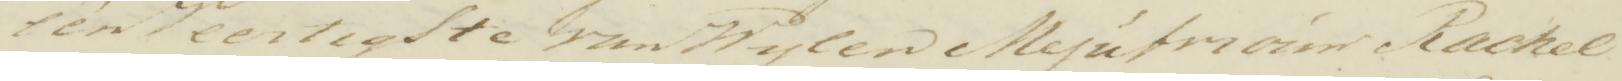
één Veertigste van Wylen Mejufvrouw Rachel
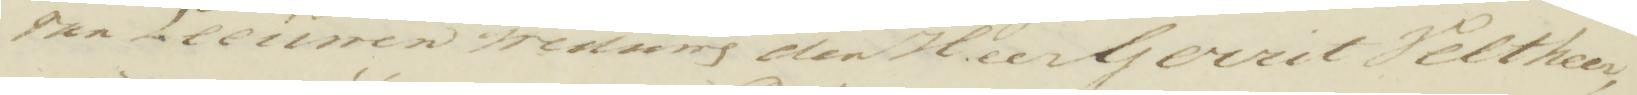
van Leeuwen weduwe den Heer Gerrit Veltheer,
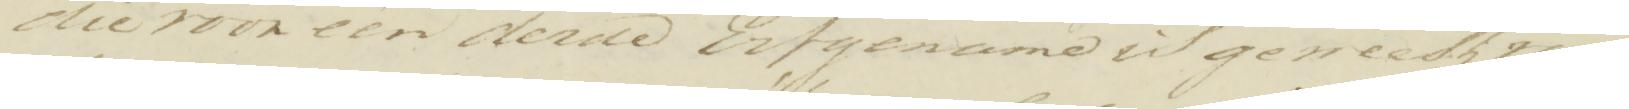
die voor één derde Erfgename is geweest van
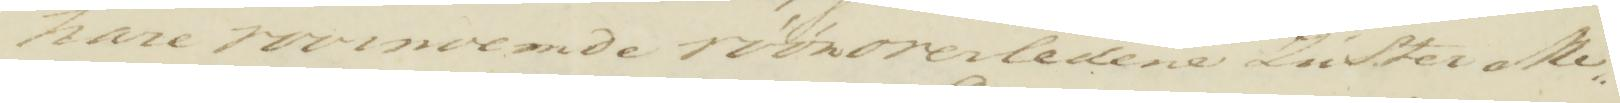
hare voornoemde vóóroverledene Zuster Me„
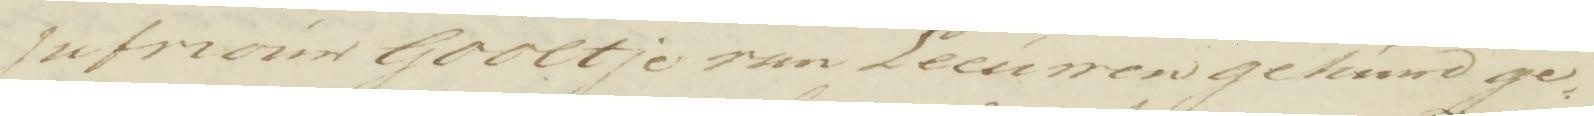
jufvrouw Gooltje van Leeuwen gehuwd ge„
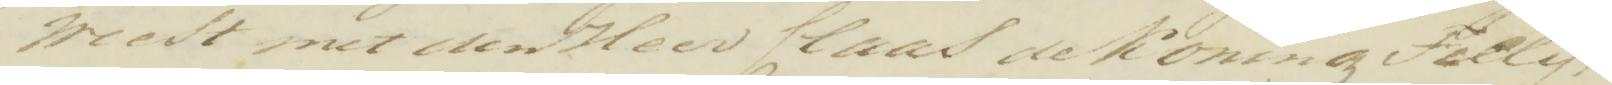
weest met den Heer Claas de Koning Tilly:
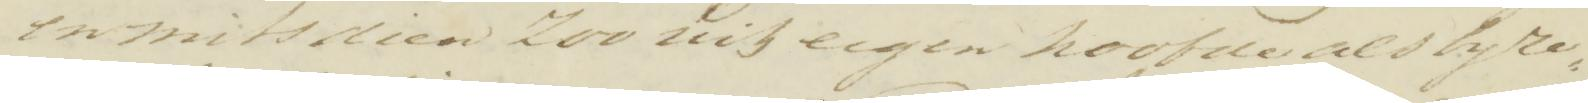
en mitsdien zoo uit eigen hoofde als by re„
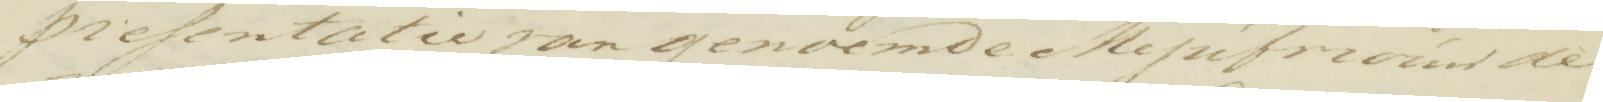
presentatie van genoemde Mejufvrouw de
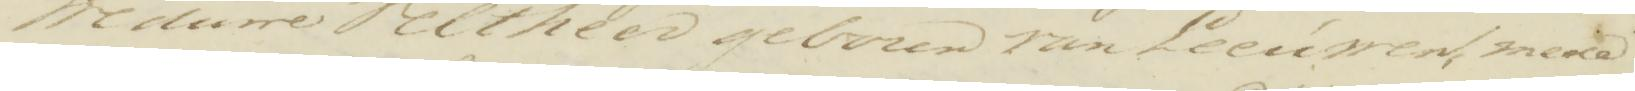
weduwe Veltheer geboren van Leeuwen, mede
